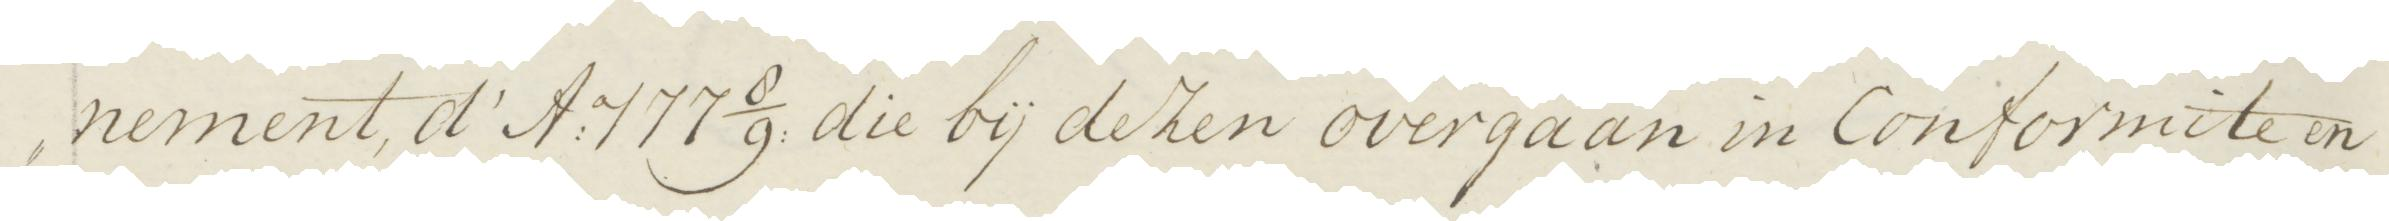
„nement, d’ A:177 8/9: die bij dezen overgaan in conformite en
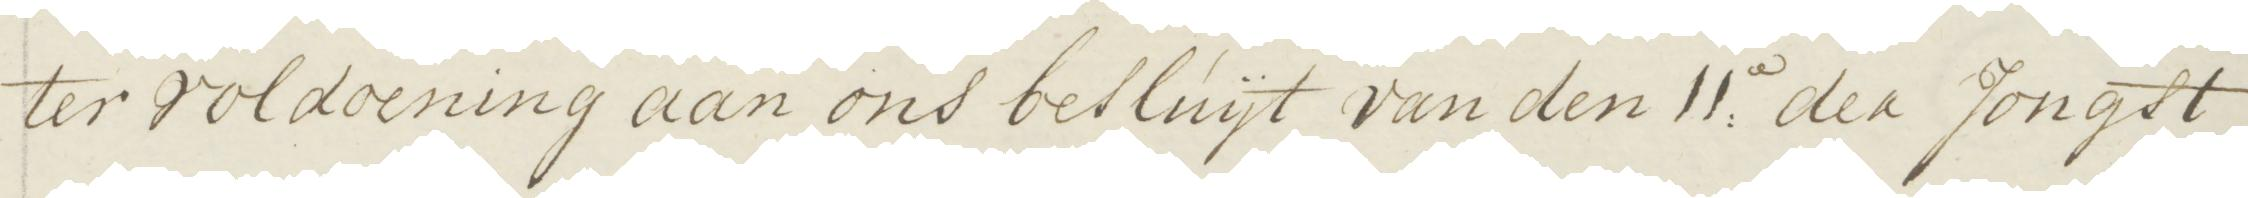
ter voldoening aan ons besluijt van den 11:e der Jongst
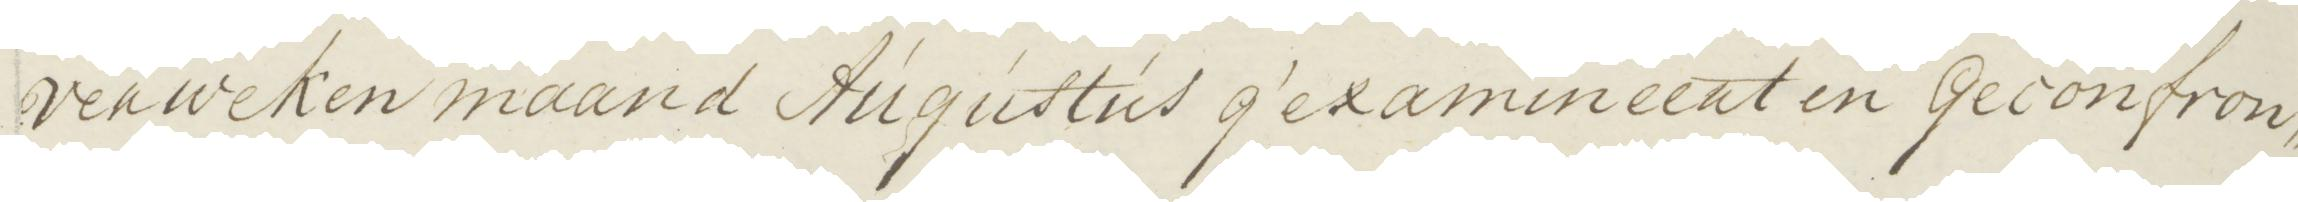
verweken maand Augustus g'examineert en Geconfron„
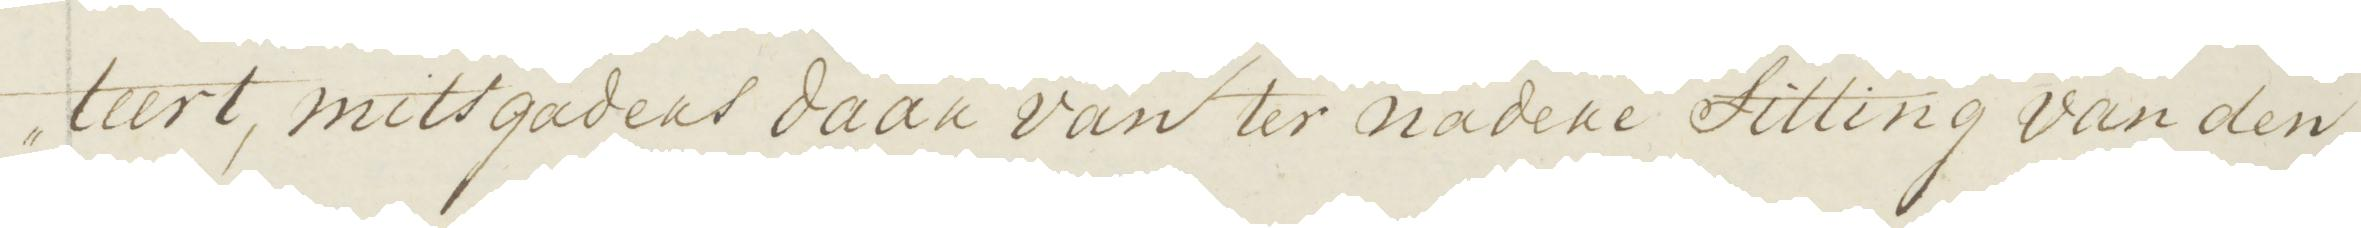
„teert, mitsgaders daar van ter nadere Sitting van den
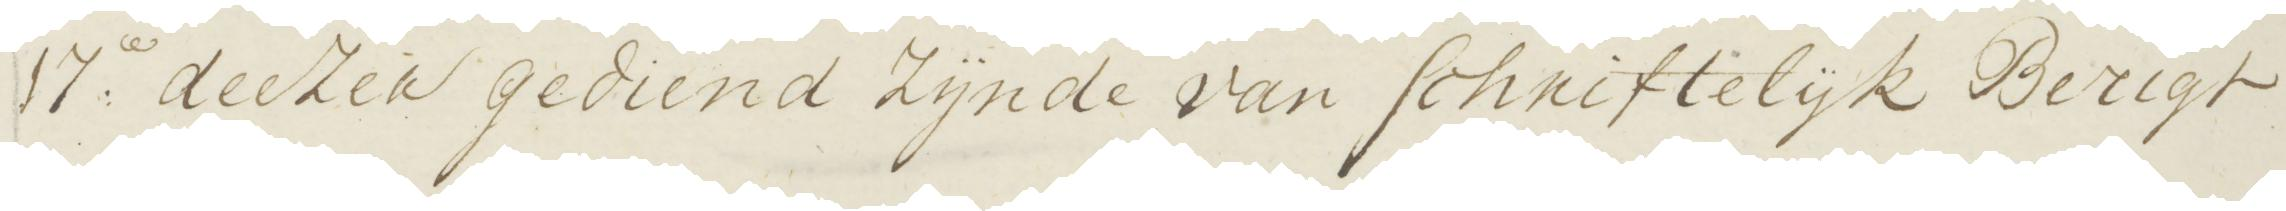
17:e deezer gediend zijnde van schriftelijk Berigt
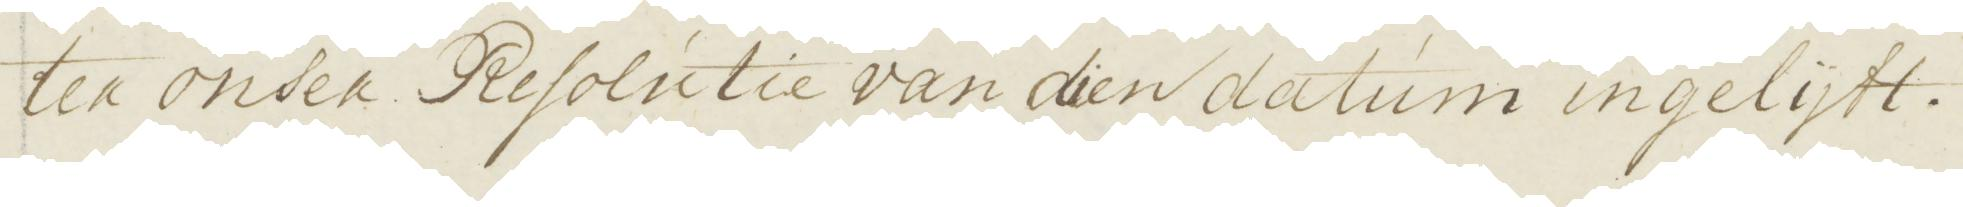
ter onser Resolutie van dien datum ingelijft.
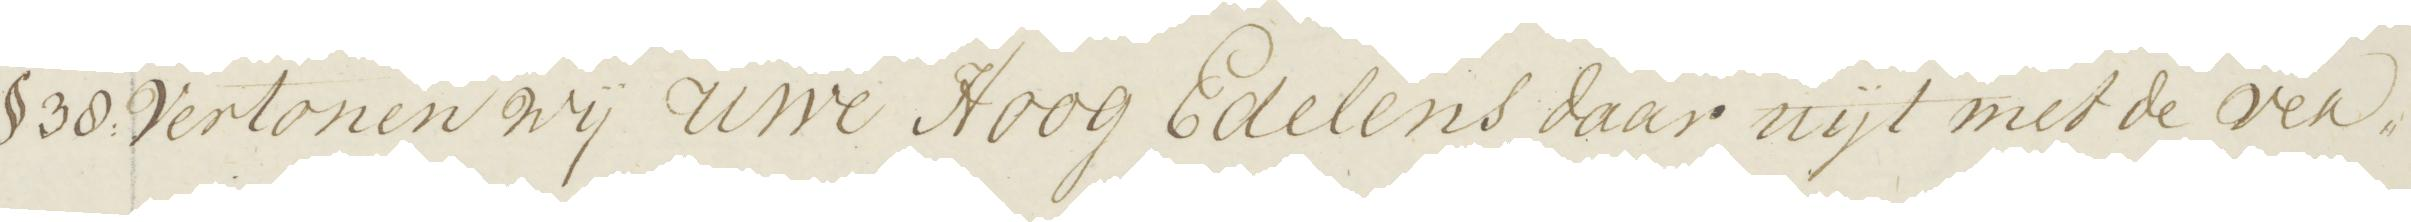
§ 38: Vertonen wij uwe Hoog Edelens daar uijt met de ver„
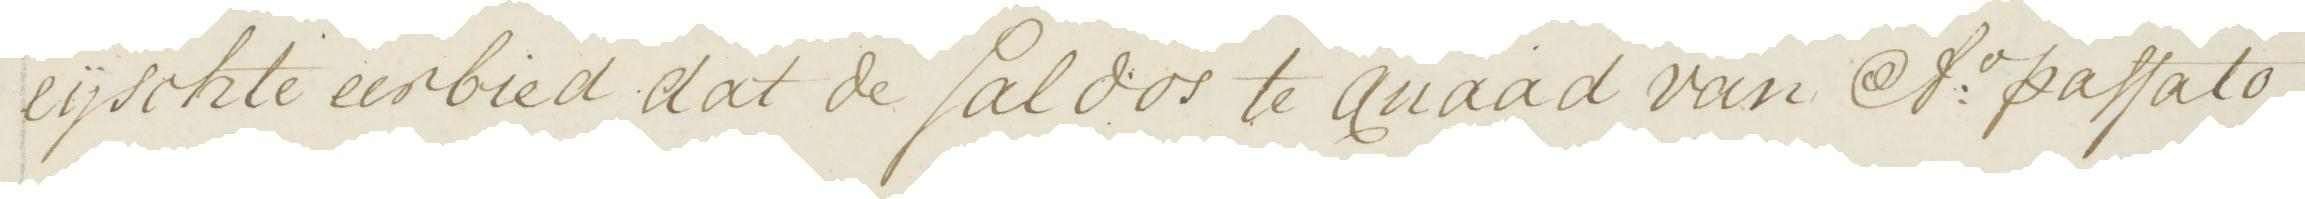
eijschte eerbied dat de saldos te quaad van A:o passato
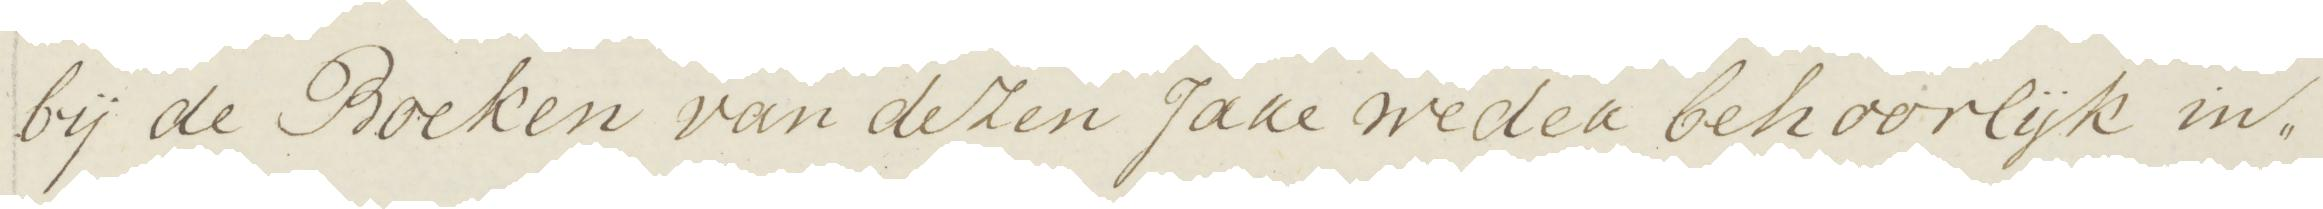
bij de Boeken van dezen Jare weder behoorlijk in„
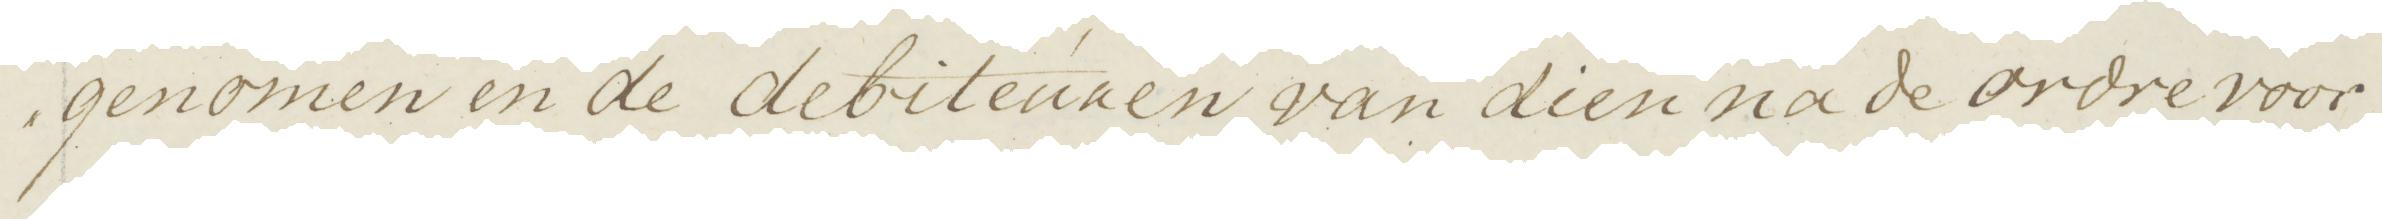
„genomen en de debiteuren van dien na de ordre voor
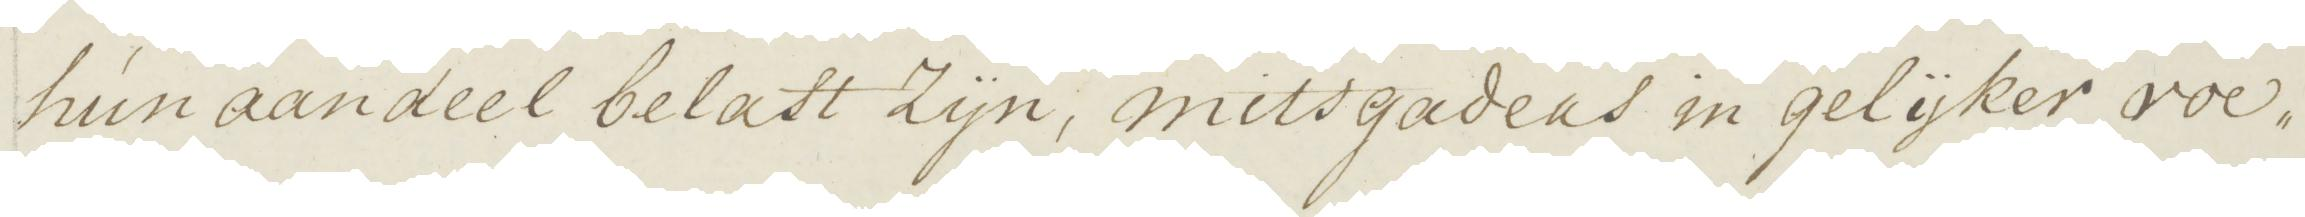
hun aandeel belast zijn, mitsgaders in gelijker voe„
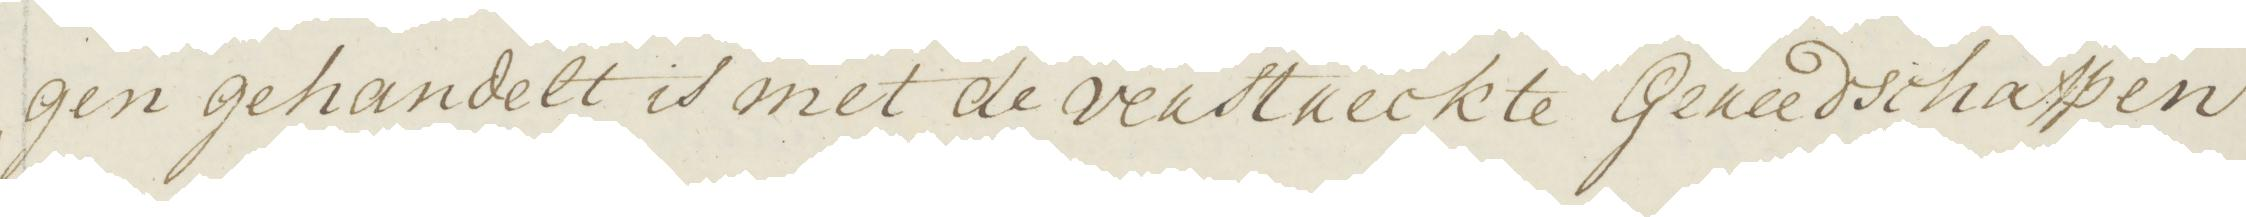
„gen gehandelt is met de verstreckte Gereedschappen
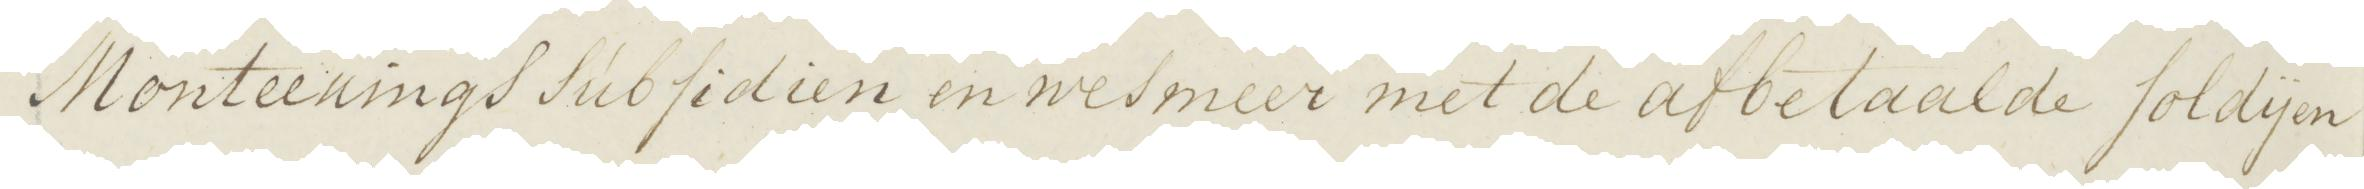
Monteerings subsidien en wesmeer met de afbetaalde soldijen
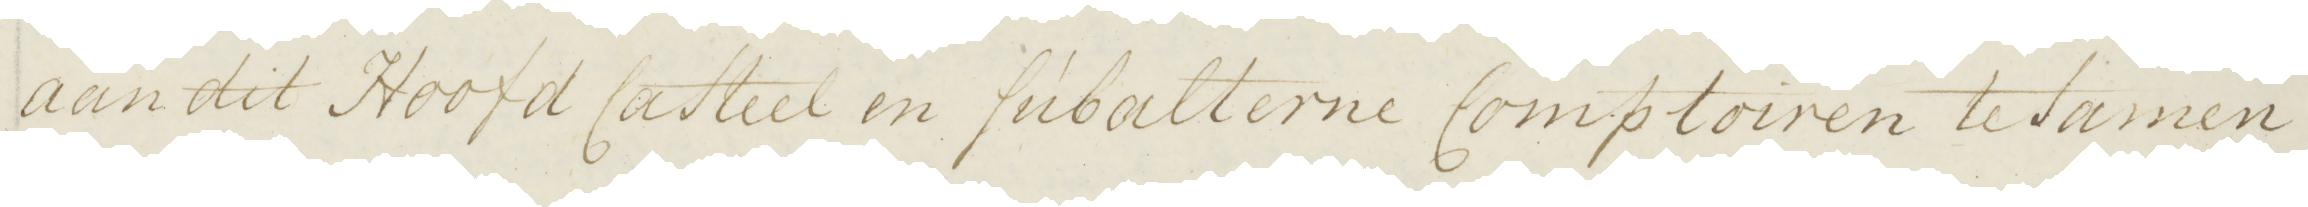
aan dit Hoofd Casteel en subalterne Comptoiren tesamen
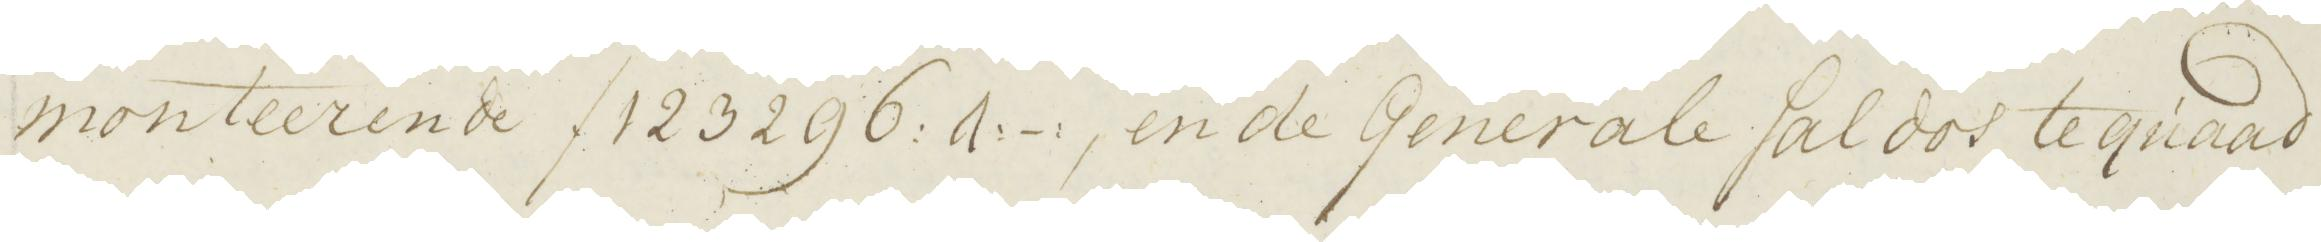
monteerende ƒ123296:4:-:, en de Generale saldos te quaad
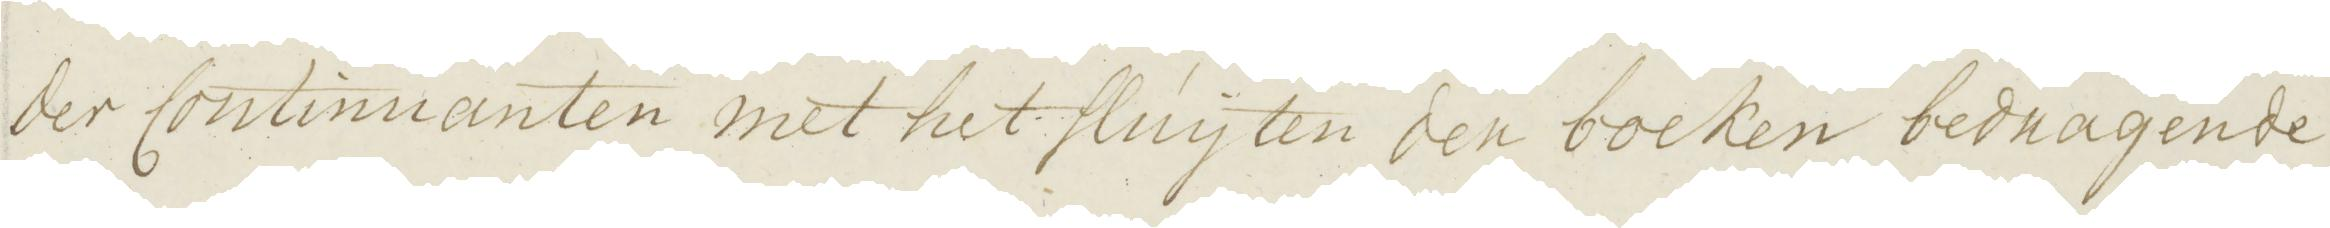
der continuanten met het sluijten der boeken bedragende
